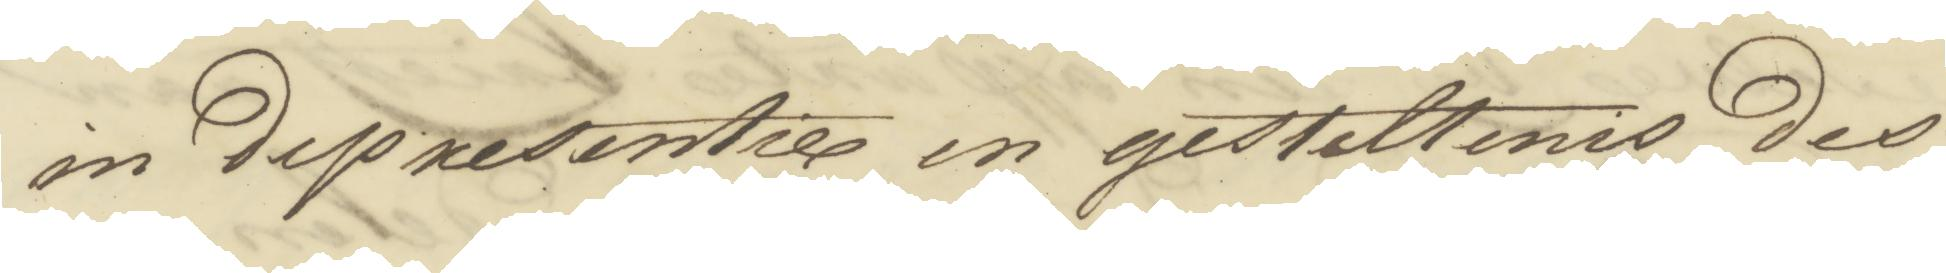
in depresentie en gesteltenis des
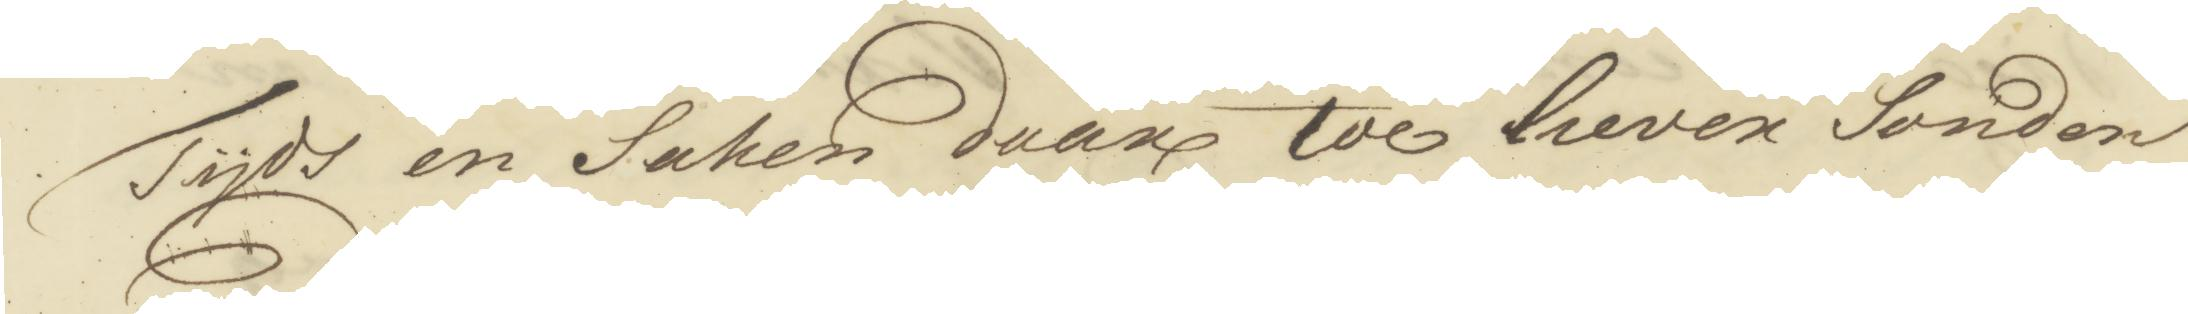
Tijds en saken daar toe liever souden
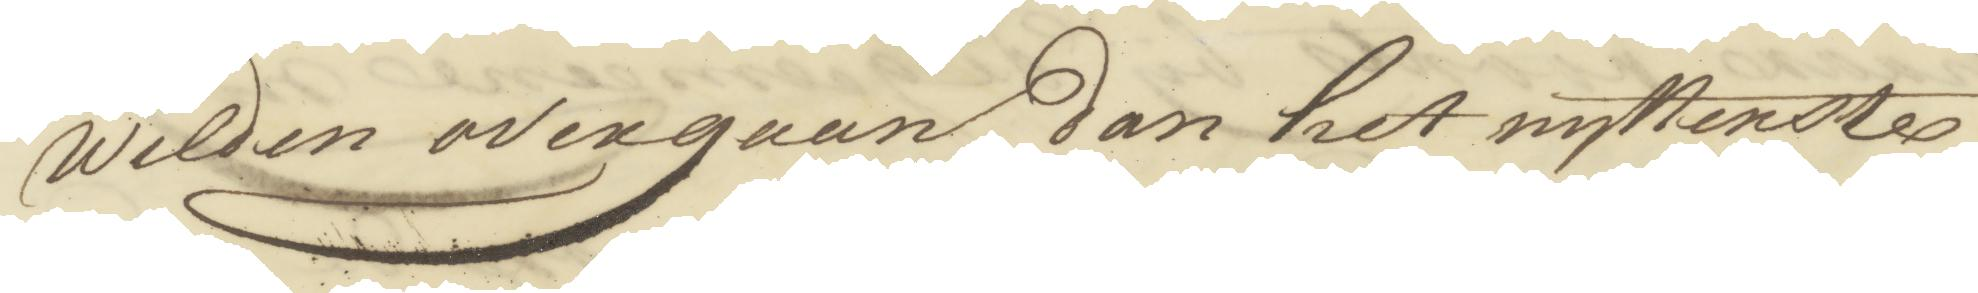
wilden overgaan dan het uytterste
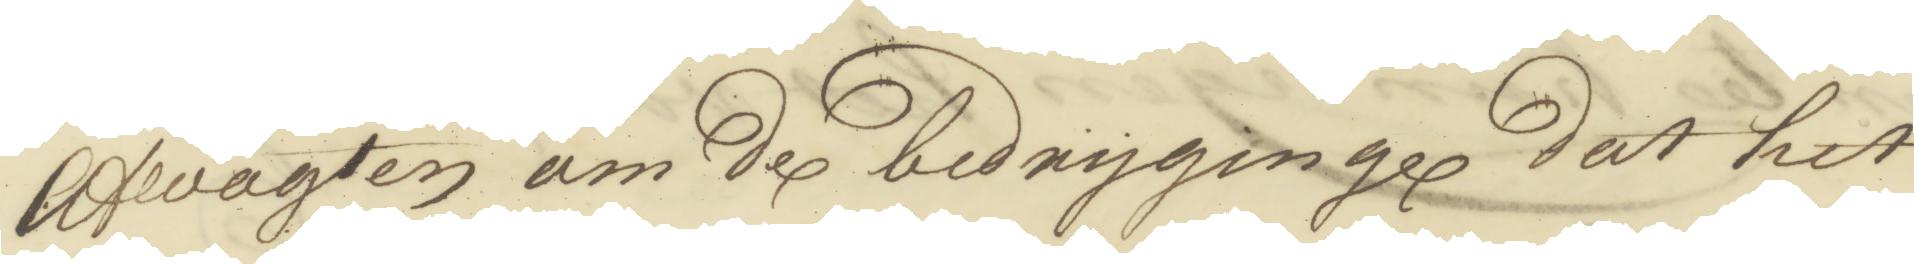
afwagten om de bedrijginge dat het
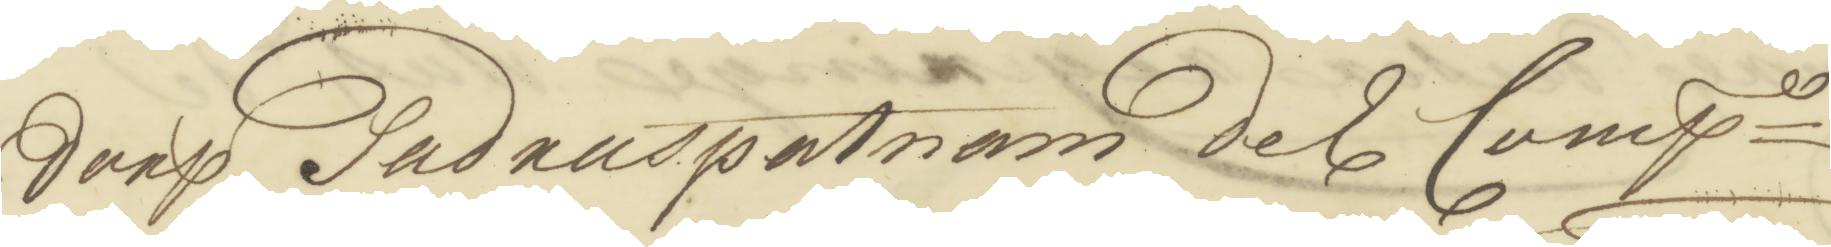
dorp sadraspatnam deE Comp=e
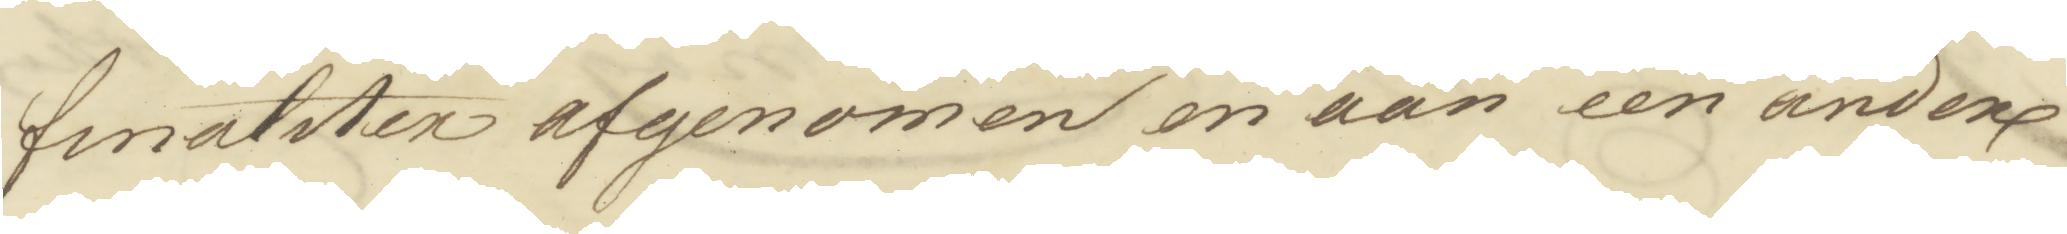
finaliter afgenomen en aan een ander
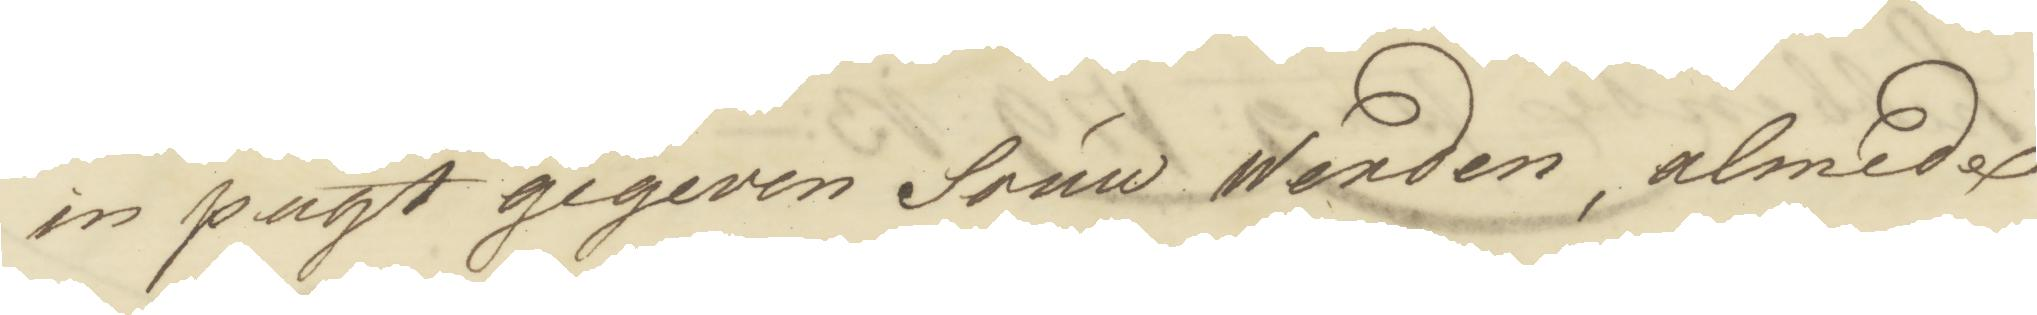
in pagt gegeven souw werden, almede
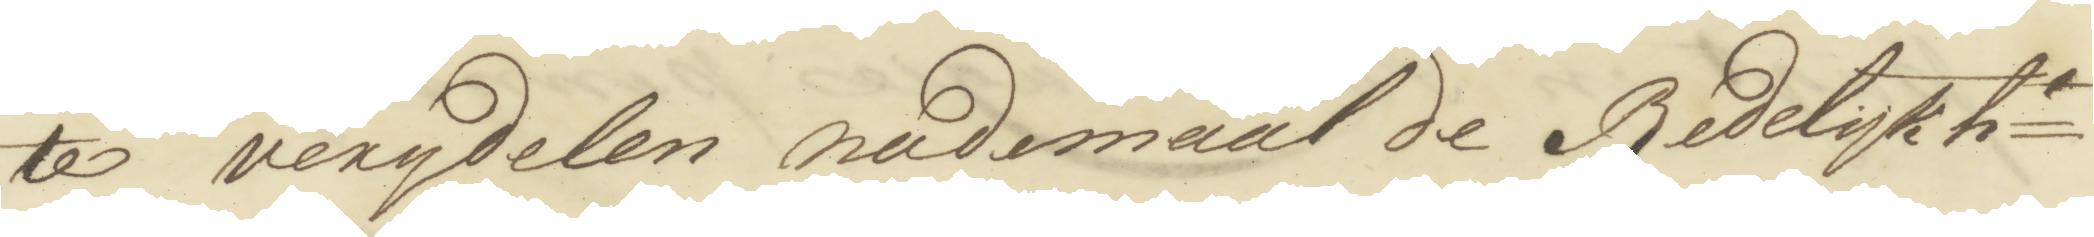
te verijdelen nademaal de Redelijkh=t
